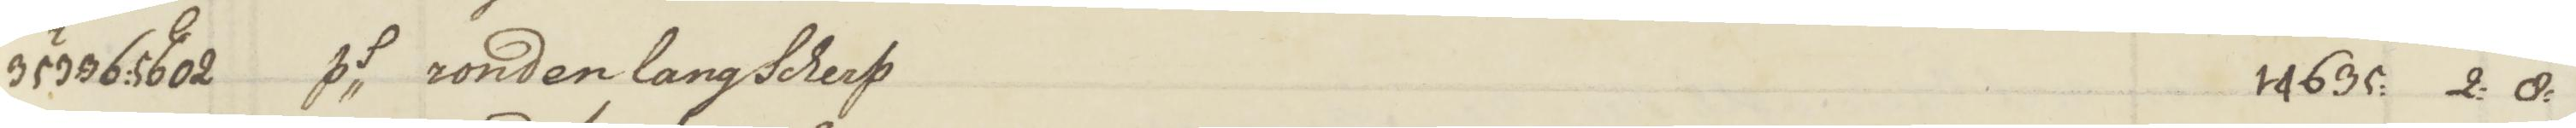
35336:5602 p„s ronden lang Scherp 14635: 2: 8:
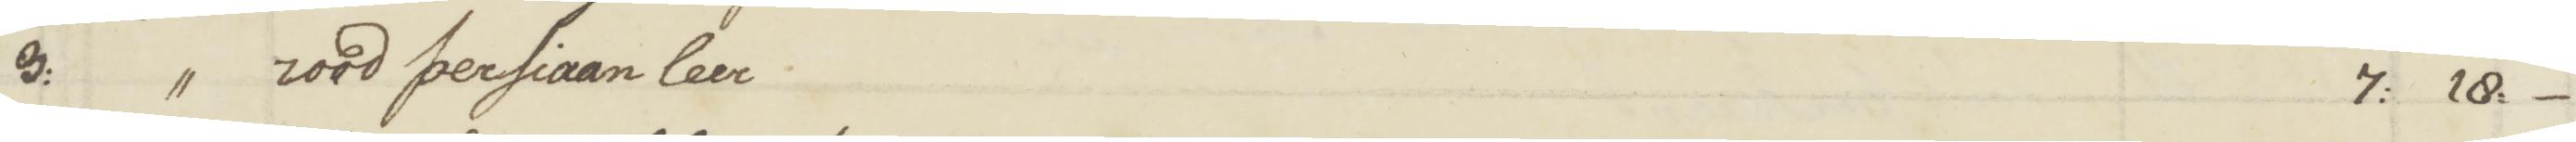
3: „ rood persiaan leer 7: 18: —
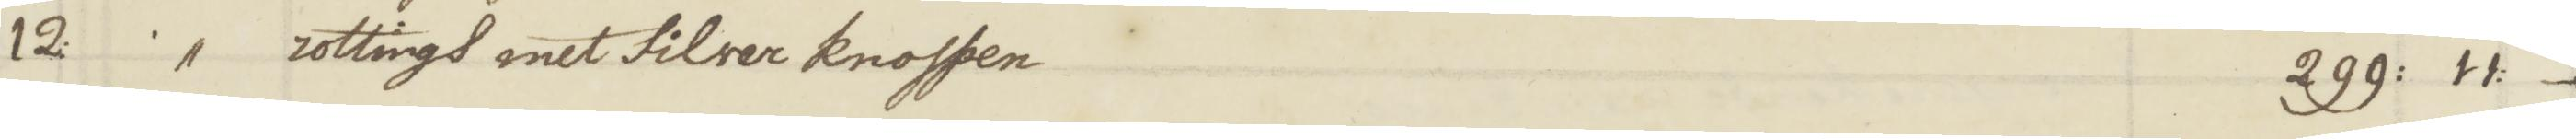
12: „ rottings met Silver knoppen 299: 11: —:
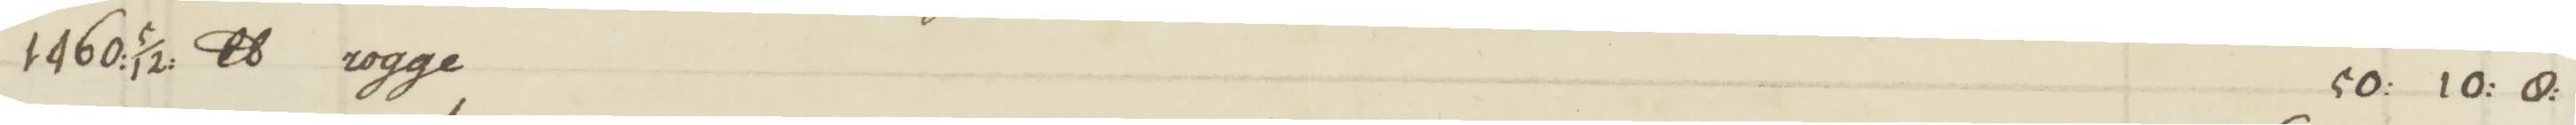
1460: 5/12: lb rogge 50: 10: 8:
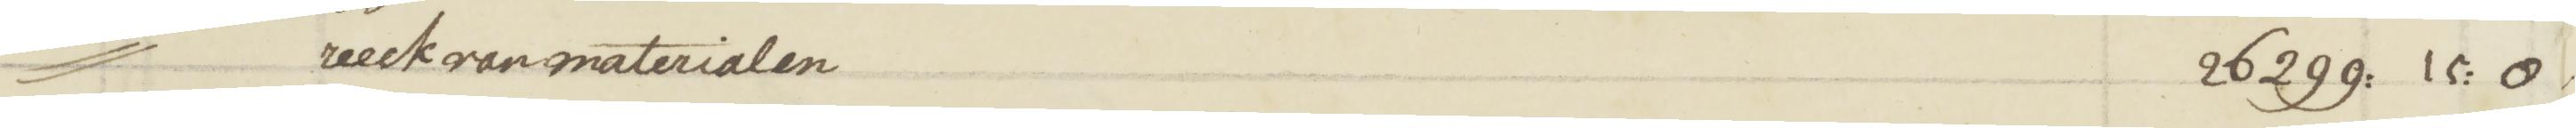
// reeck van materialen 26299: 15: 8:
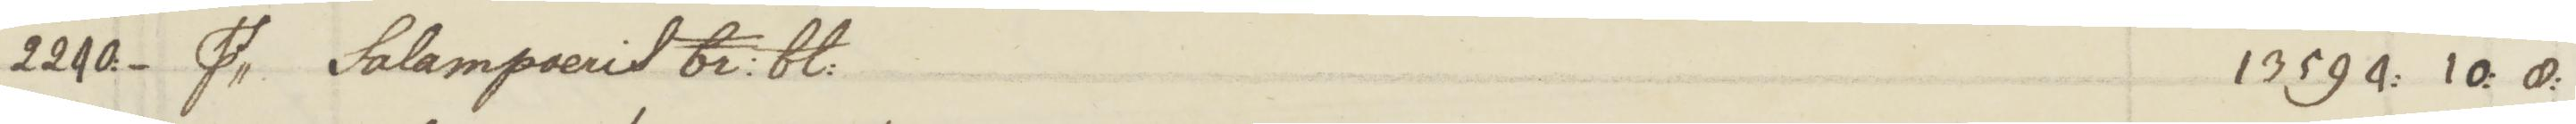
2240: — p„s Salampoeris br: bl: 13594: 10: 8:
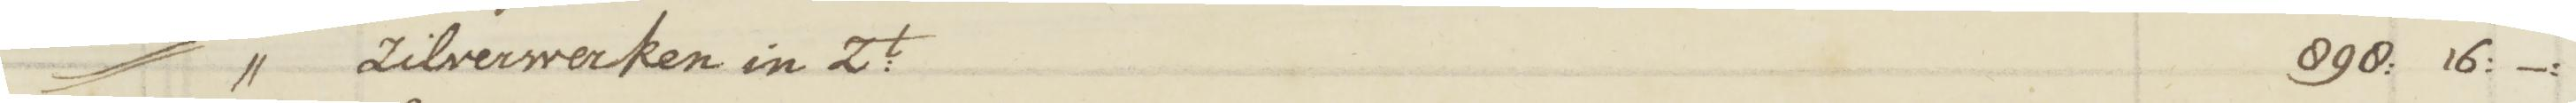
// „ Zilverwerken in z:t 898: 16: —:
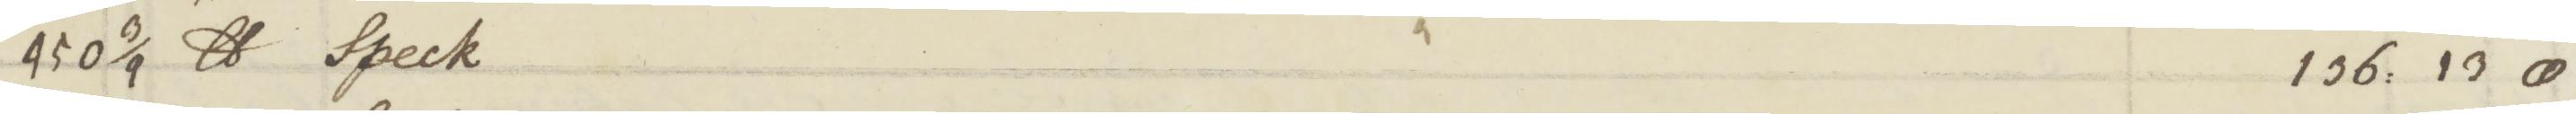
450 3/4 lb speck 136: 13 8
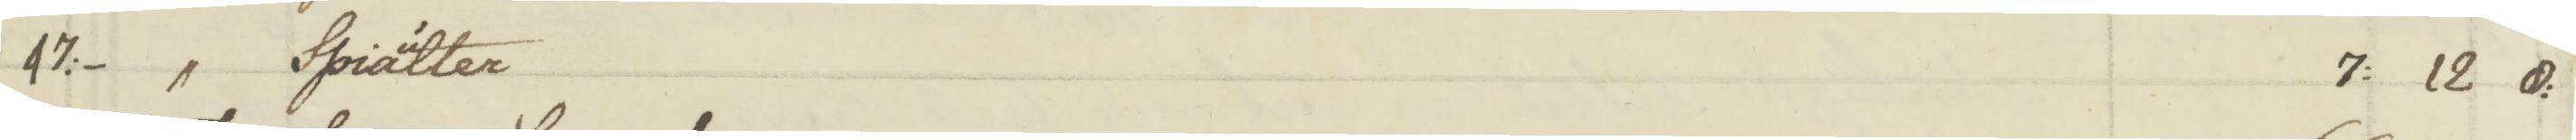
47: — „ Spialter 7: 12 8:
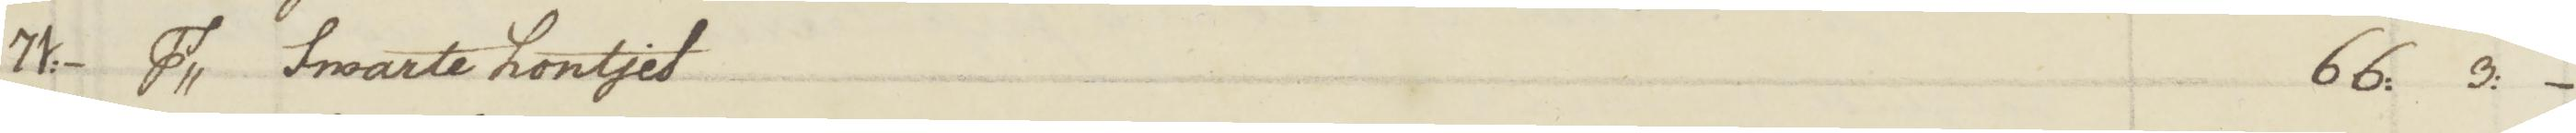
71: — p„s Swarte hontjes 66: 3: —
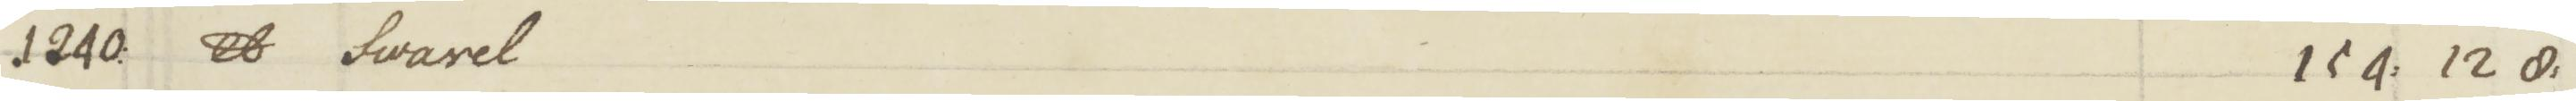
1240: lb Swavel 154: 12 8:
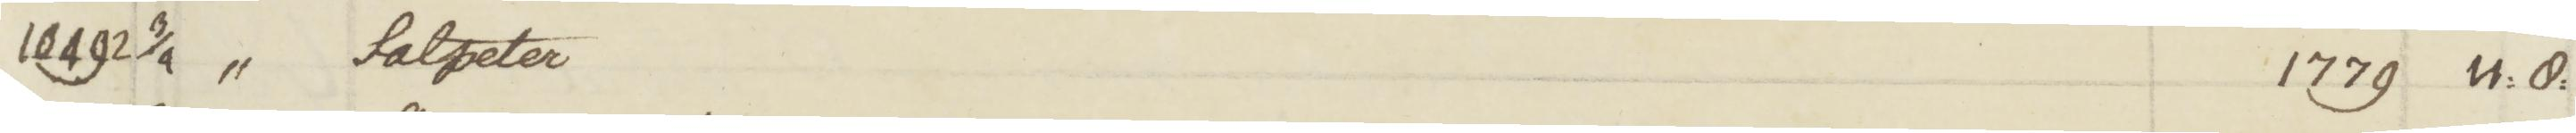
10492 ¾ „ Salpeter 1779 11: 8:
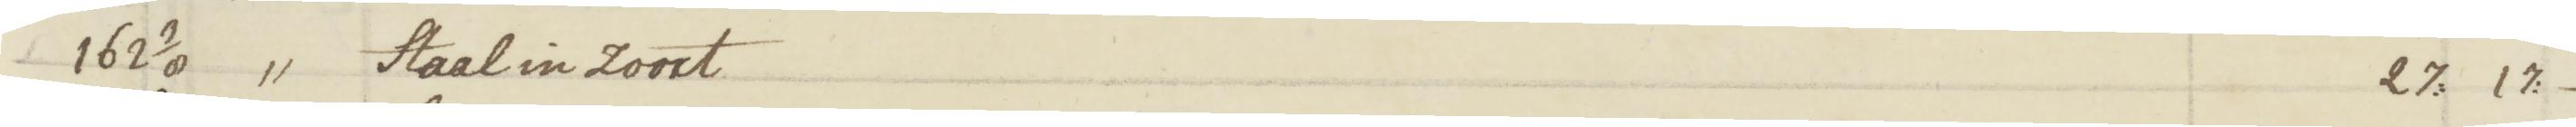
162 1/8 „ Staal in Zoort 27: 17: —
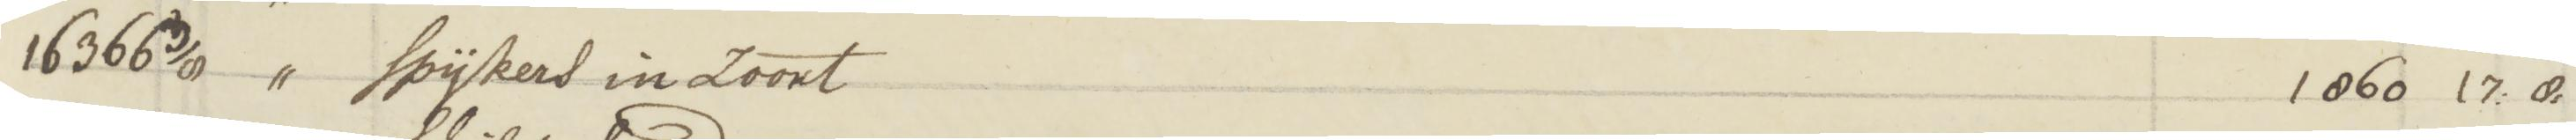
16366 3/8 „ Spijkers in Zoort 1860 17: 8.
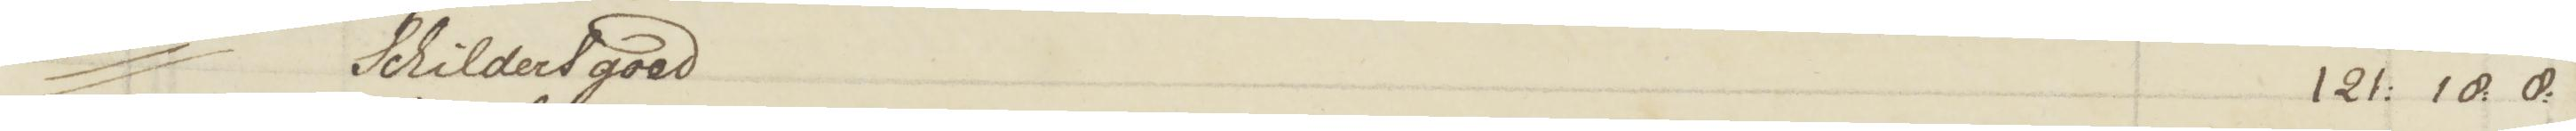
// Schilders goed 121: 18: 8:
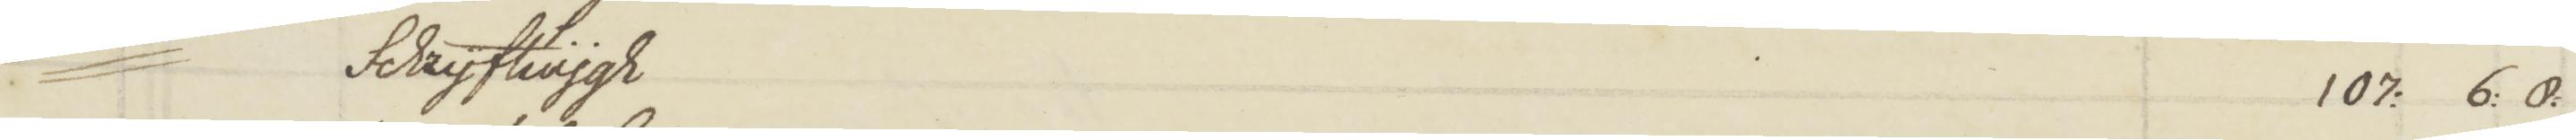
// Schrijftuijgh 107: 6: 8:
